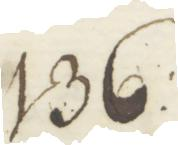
136:
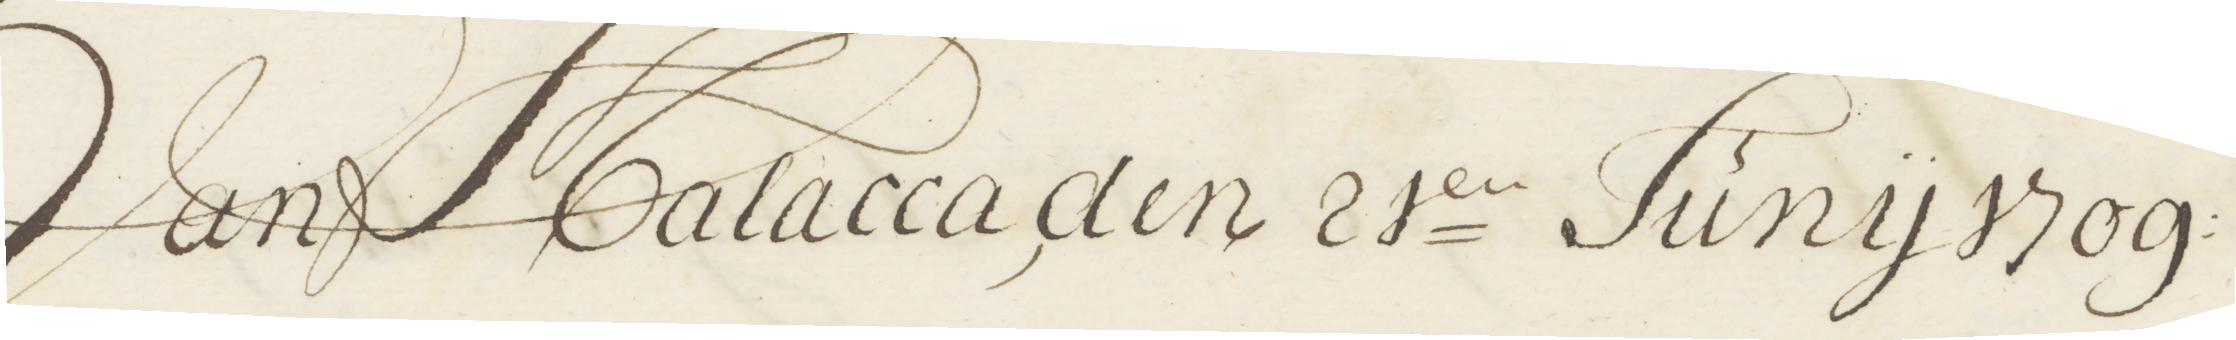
Van Malacca den 21=en Junij 1709:
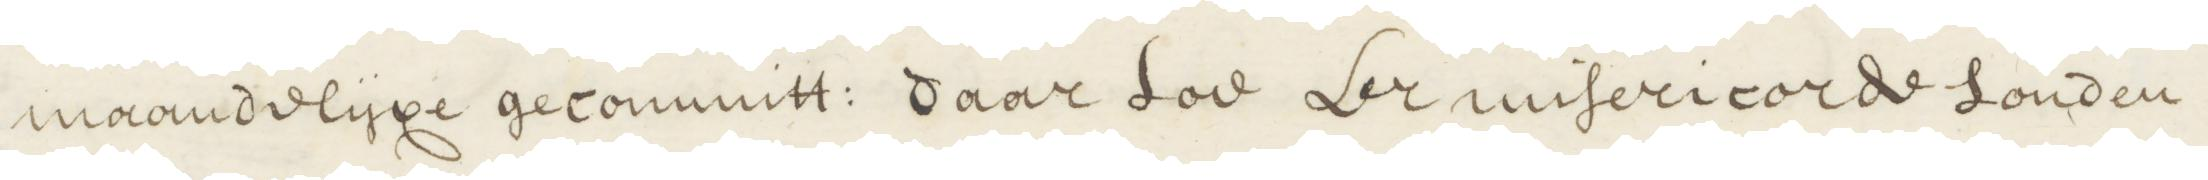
maandelijxe gecommitt:s daar toe ter misericorde souden
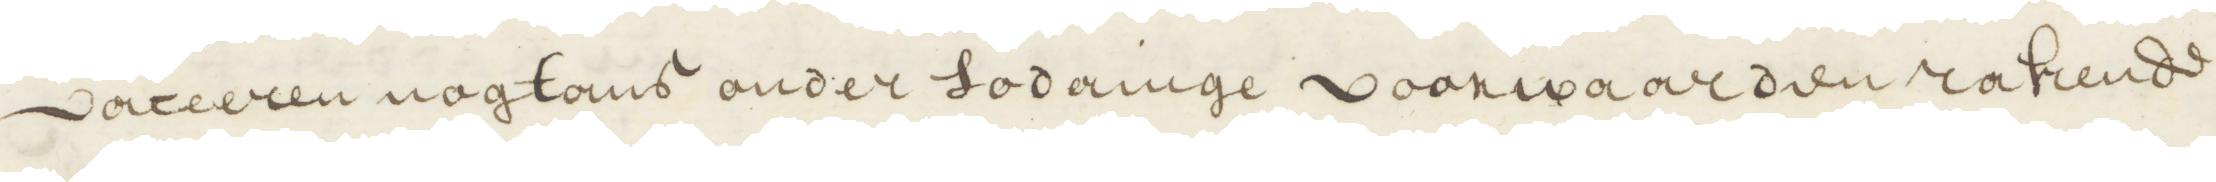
vaceeren nogtans onder sodanige voorwaarden rakende
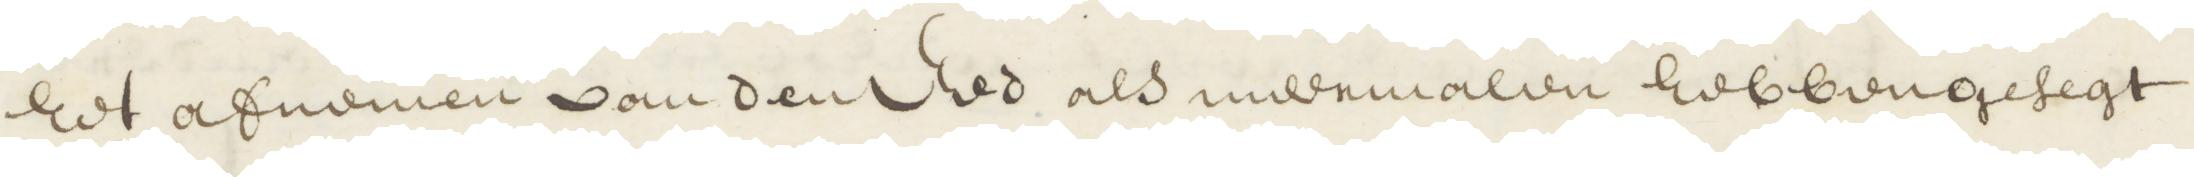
het afnemen van den Eed als meermalen hebbengesegt
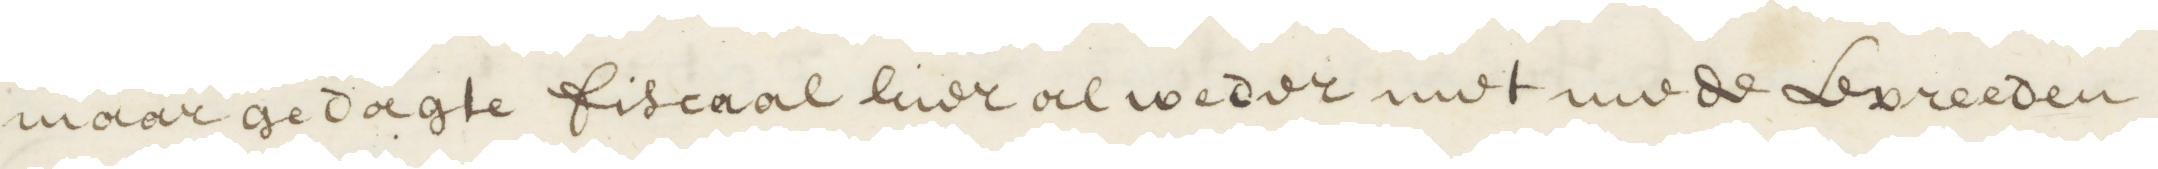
maar gedagte fiscaal hier al weder niet mede te vreeden
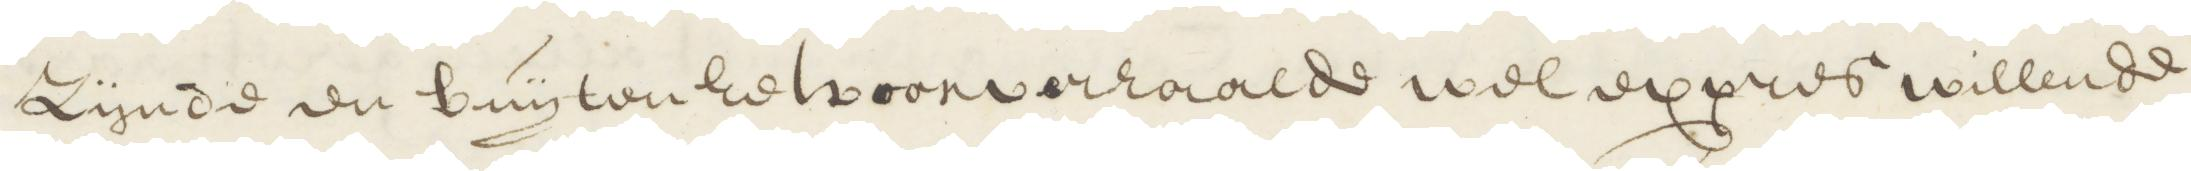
Zijnde en buijten het voorverhaalde wel expres willende
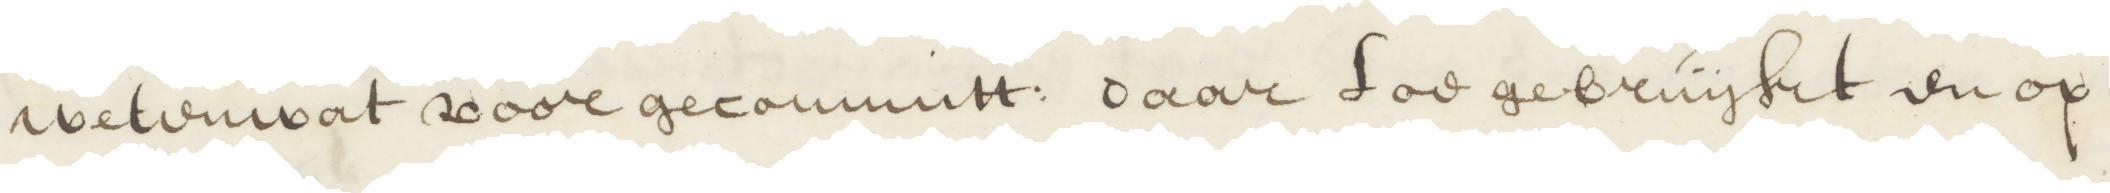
weten wat voor gecommitt:s daar toe gebruijkt en op
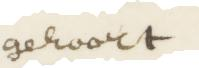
gehoort
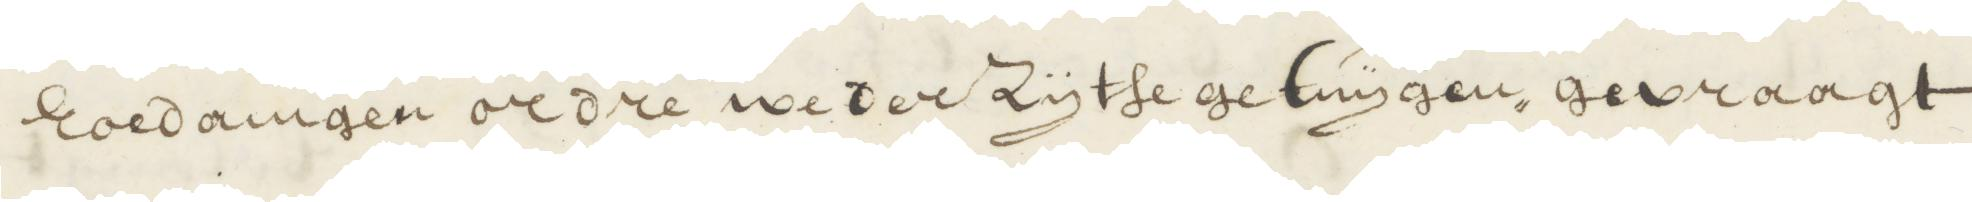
hoedanigen ordre weder Zijtse getuijgen„ gevraagt
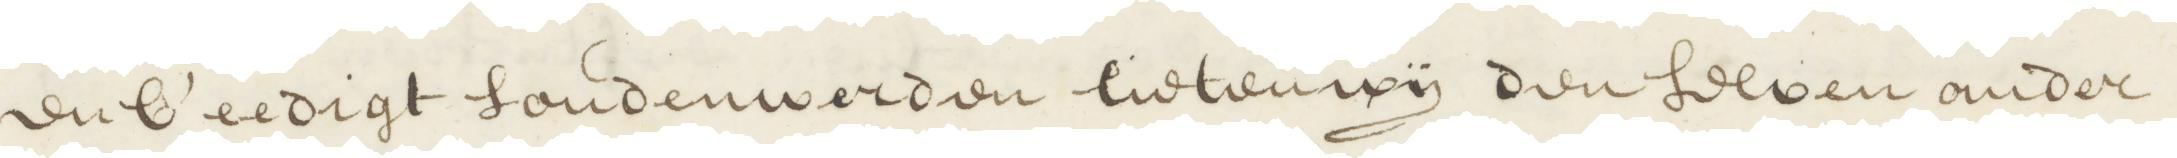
en b' eedigt soudenwerden lieten wij den selven ander
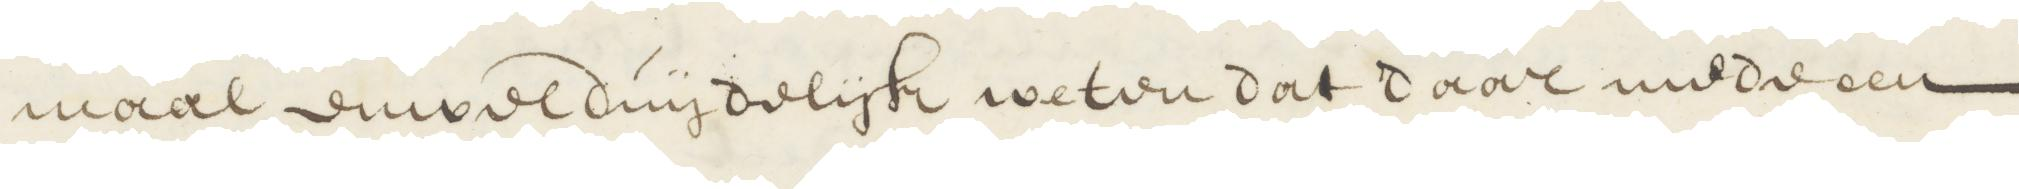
maal enwel duijdelijk weten dat daar mede een
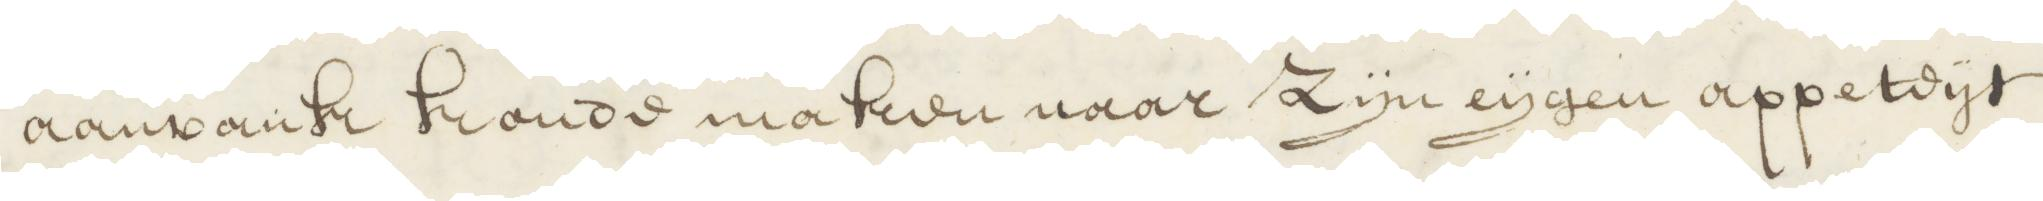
aanvank konde maken naar Zijn eijgen appeteijt
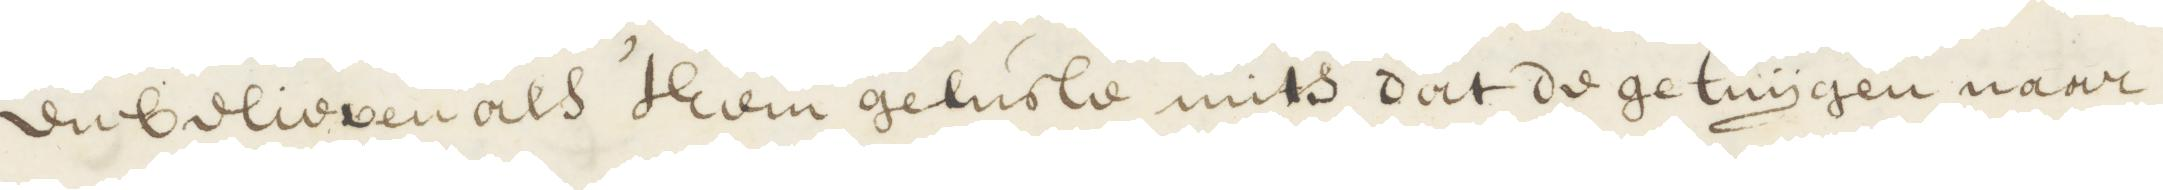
en believen als 'them geluste mits dat de getuijgen naar
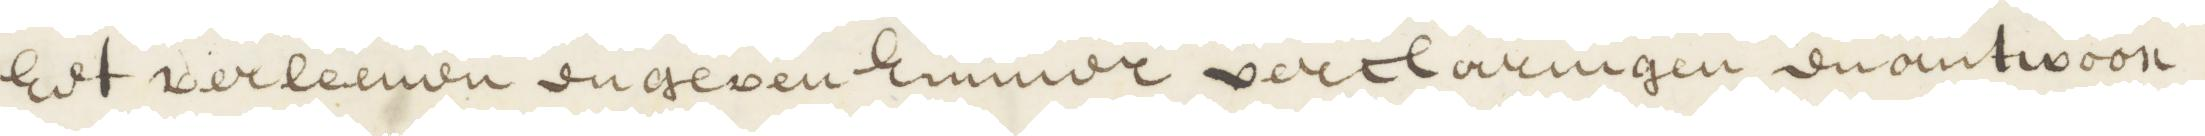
het verleenen en geven hunner verclaringen en antwoor
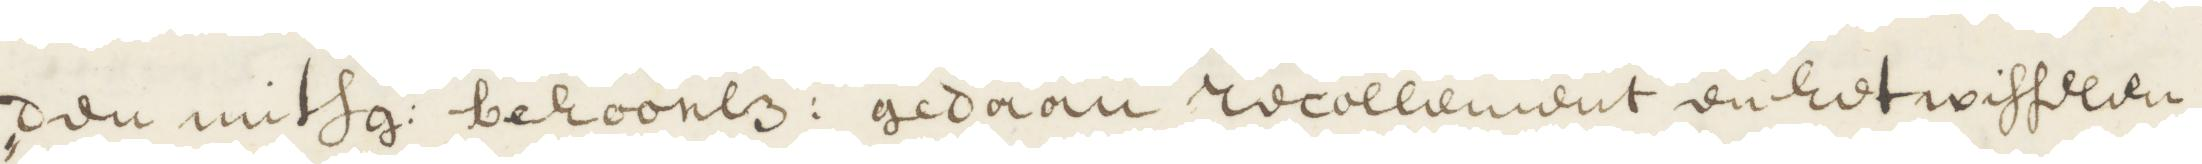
„den mitsg:s behoorlijk gedaan recollement en het wisselen
